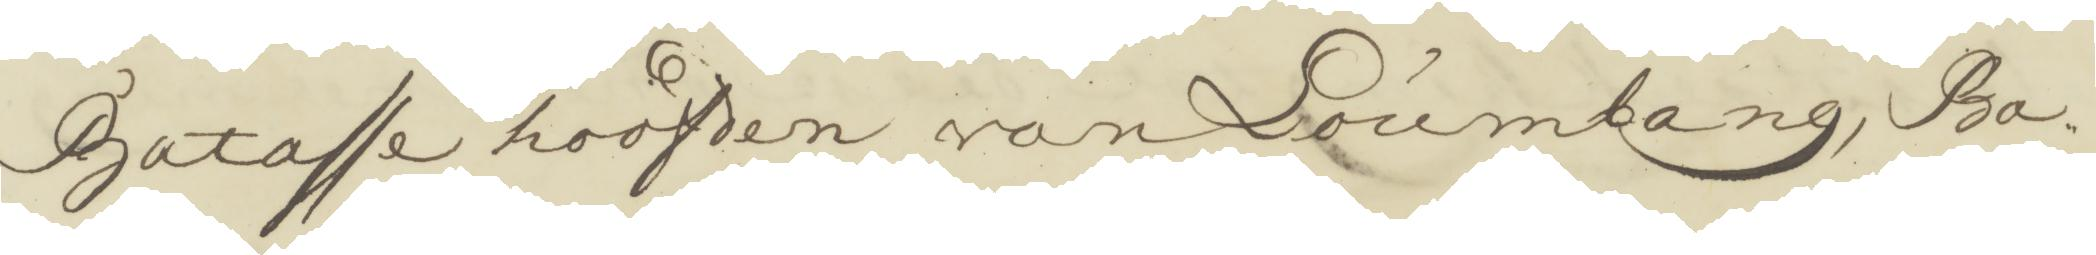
Batasse hoofden van Loumbang, Ba„
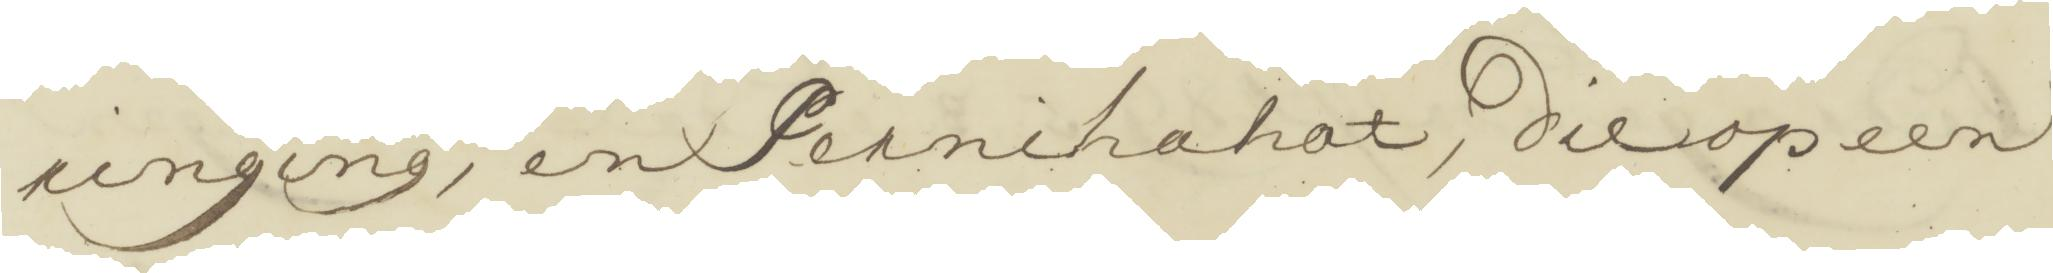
ringing, en Pernihahat, die op een
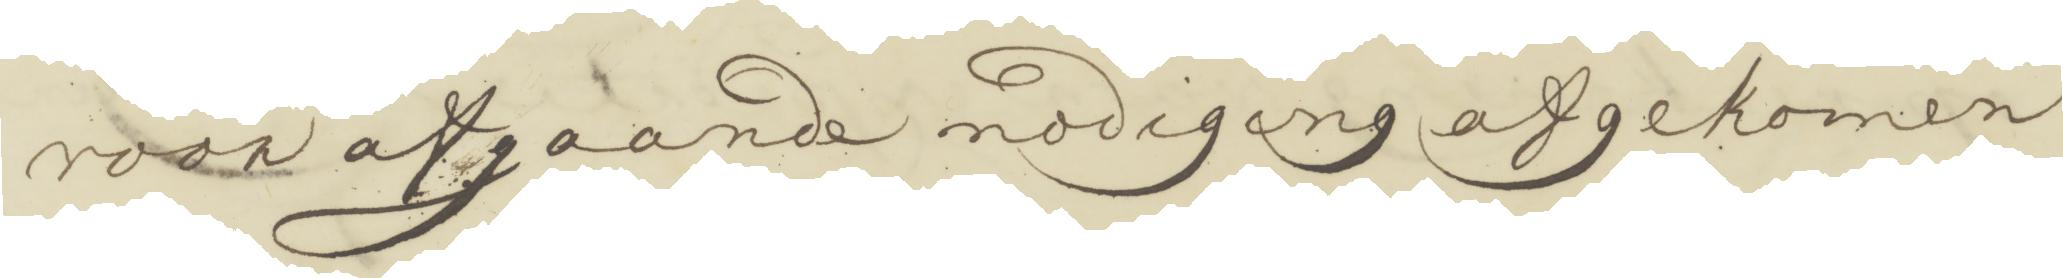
voor afgaande nodiging afgekomen
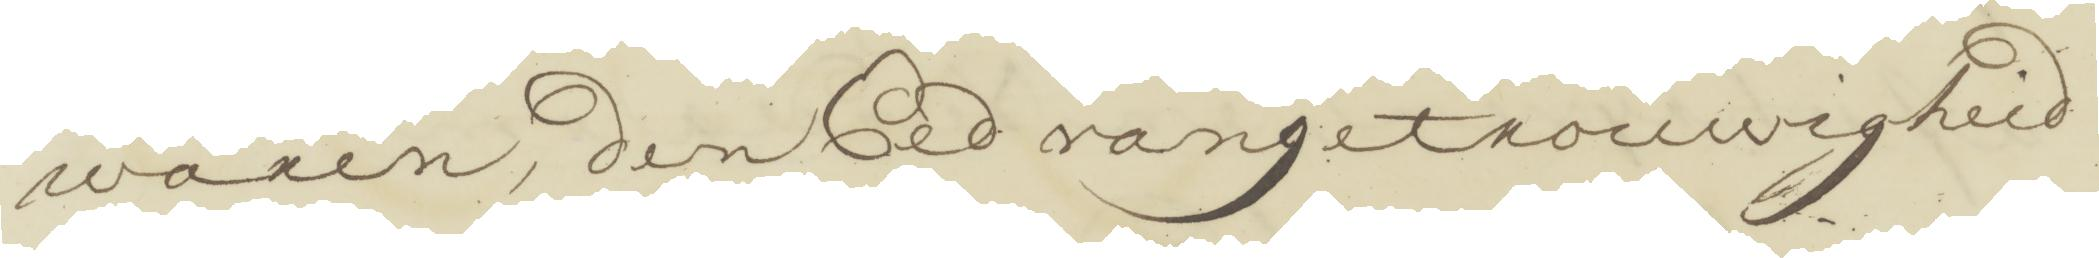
waren, den Eed vangetrouwigheid
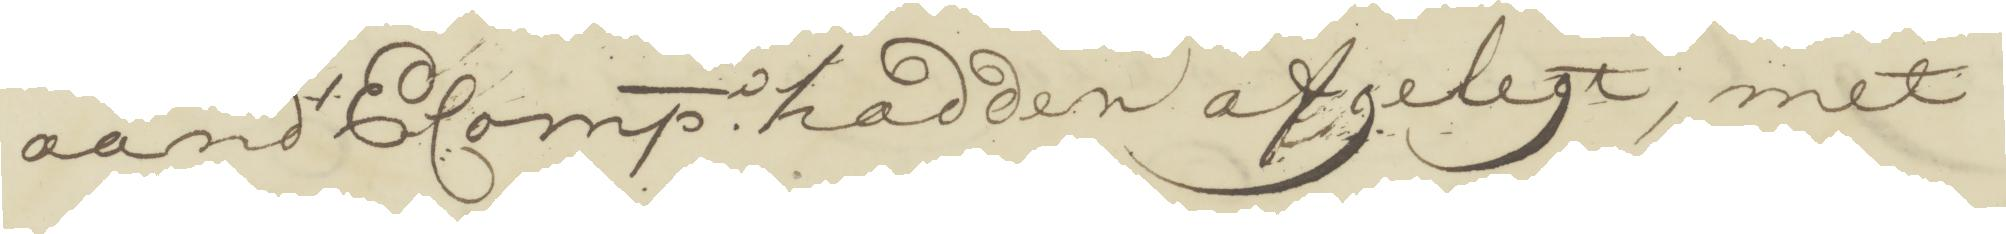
aand’E:Comp:e hadden afgelegt; met
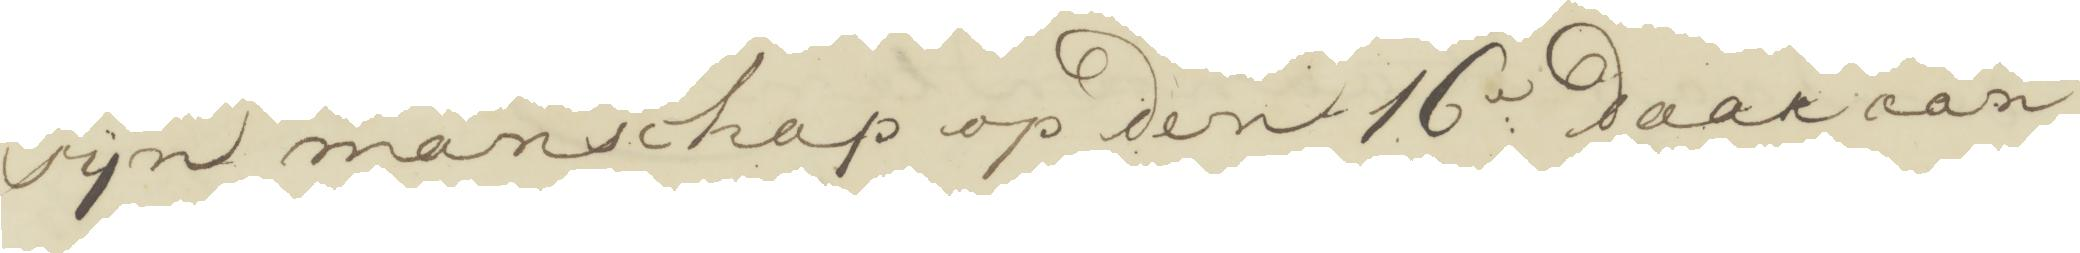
sijn manschap op den 16:e daar aan
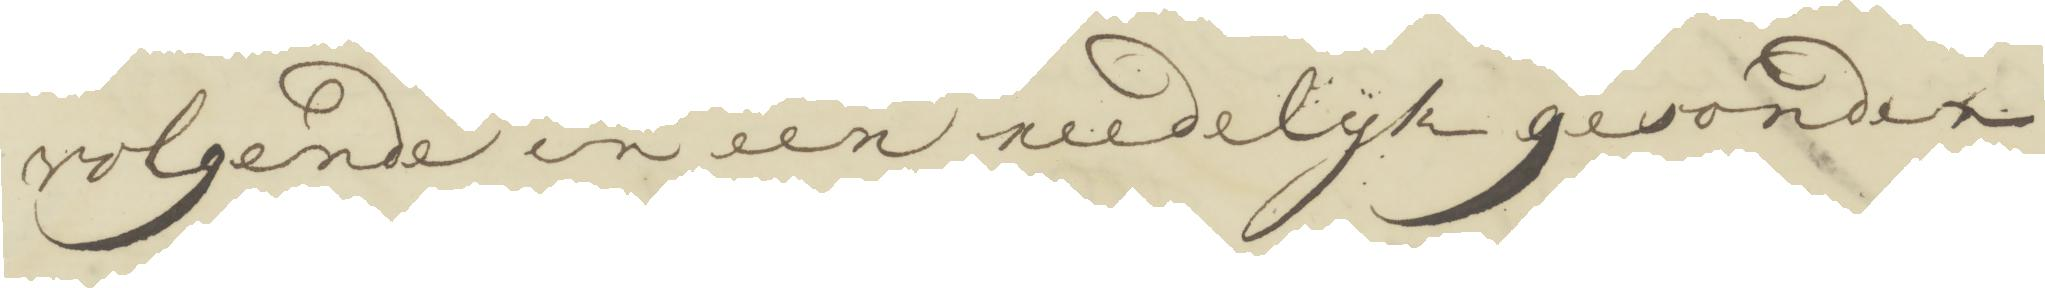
volgende in een reedelijk gevonden
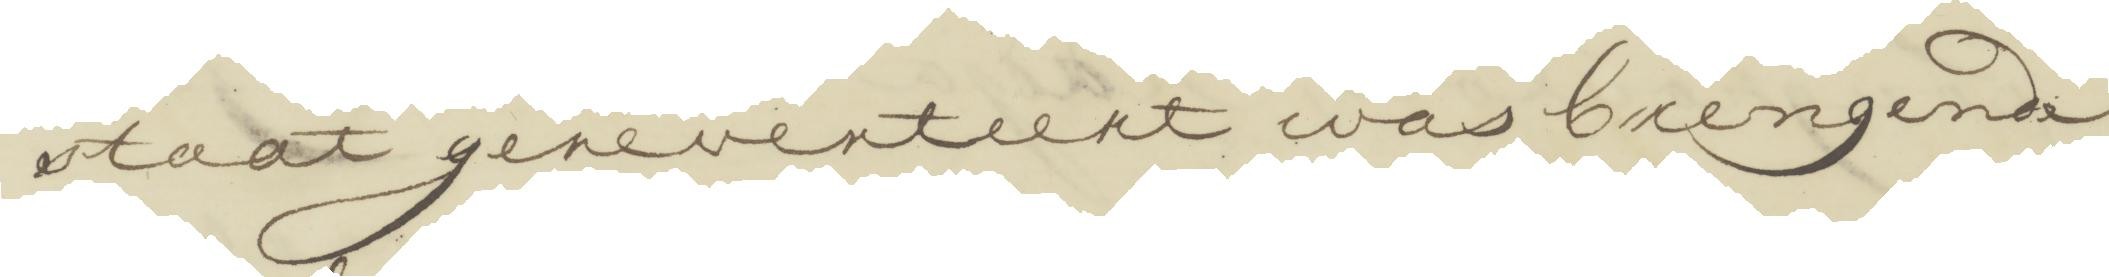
staat gereverteert was brengende,
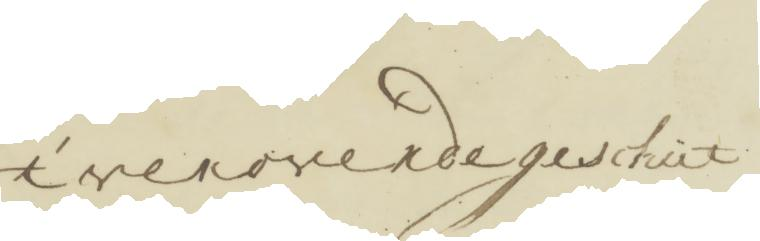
tveroverde geschut
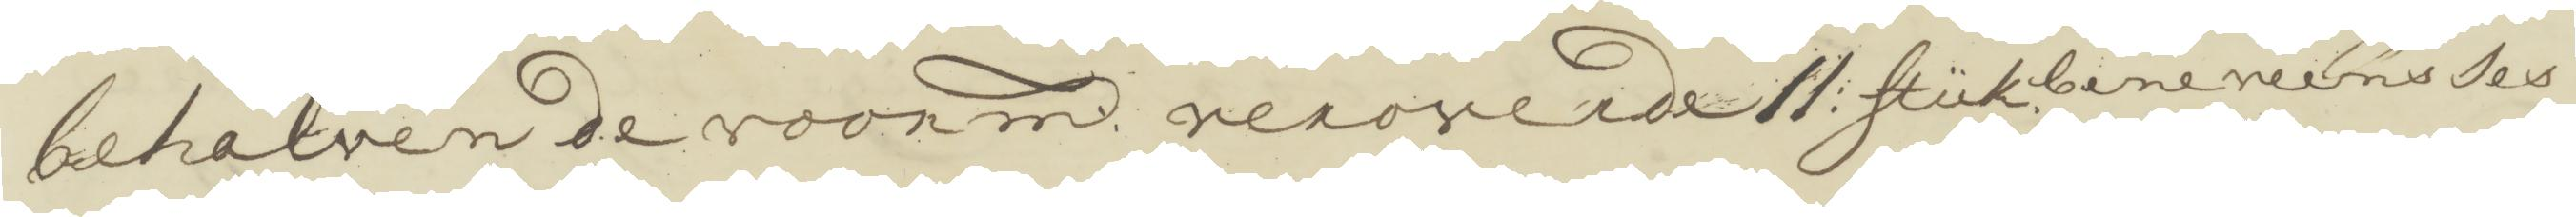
behalven de voorm: veroverde 11: stuk. benevens ses
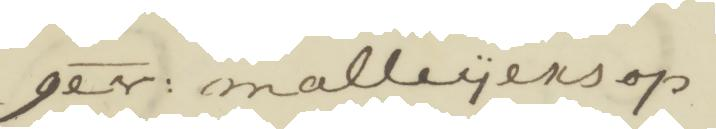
gev: malleijers op
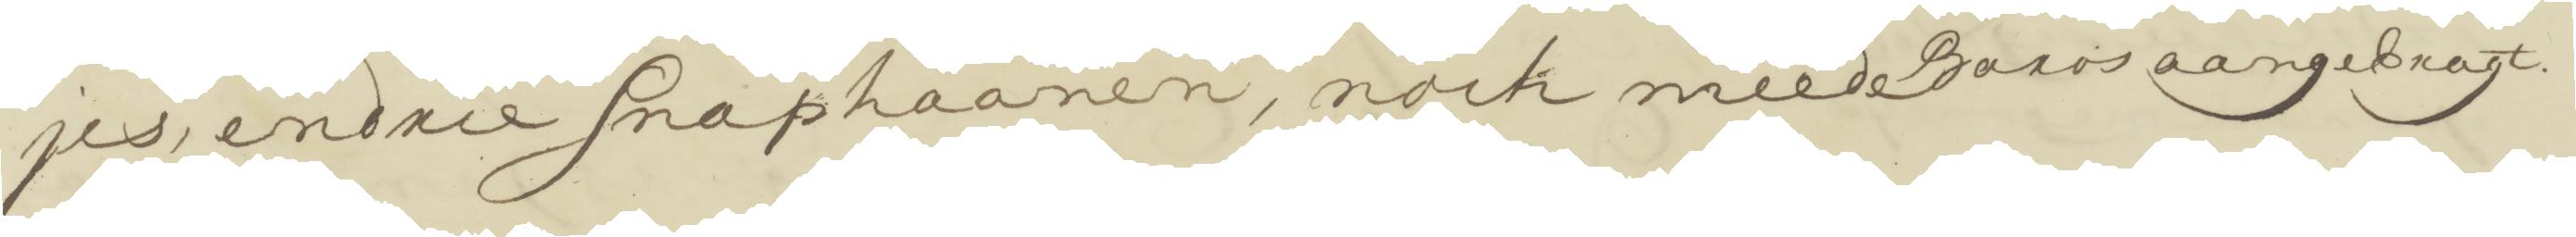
jes en drie snaphaanen, noch meede Baros aangebragt.
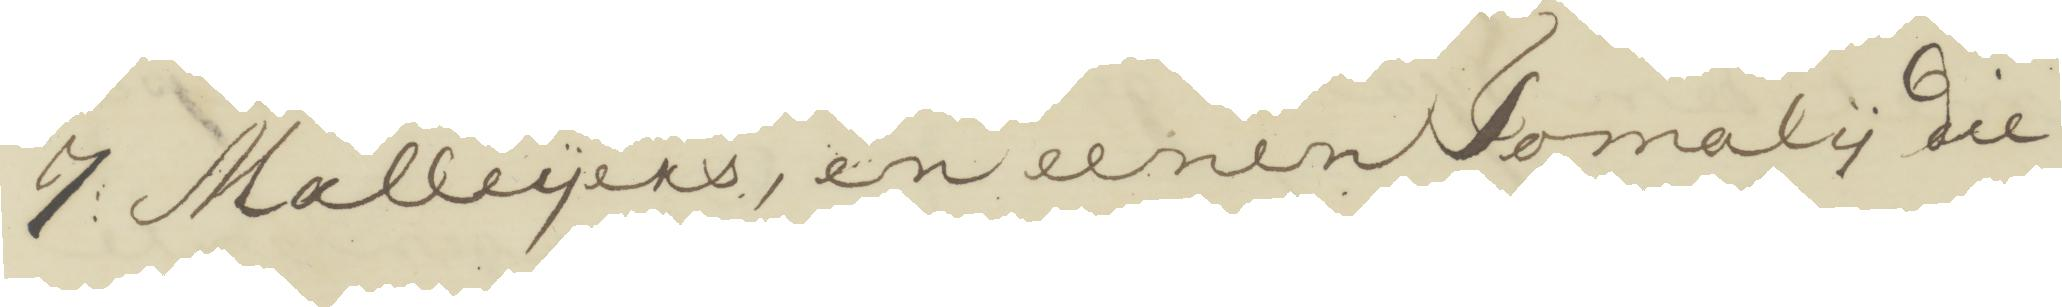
7: Malleijers, en eenen Somalij die
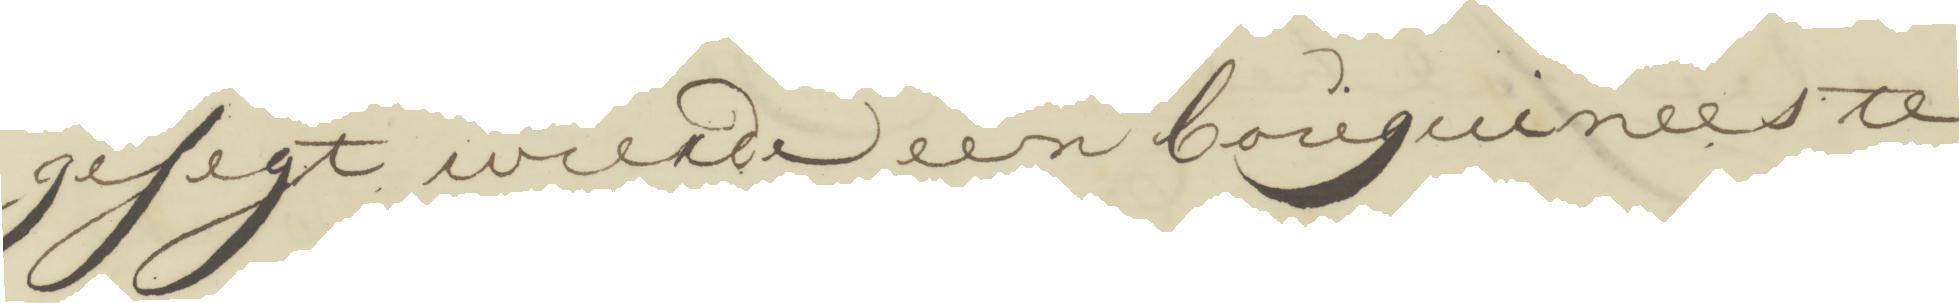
gesegt wierde een bouguinees te
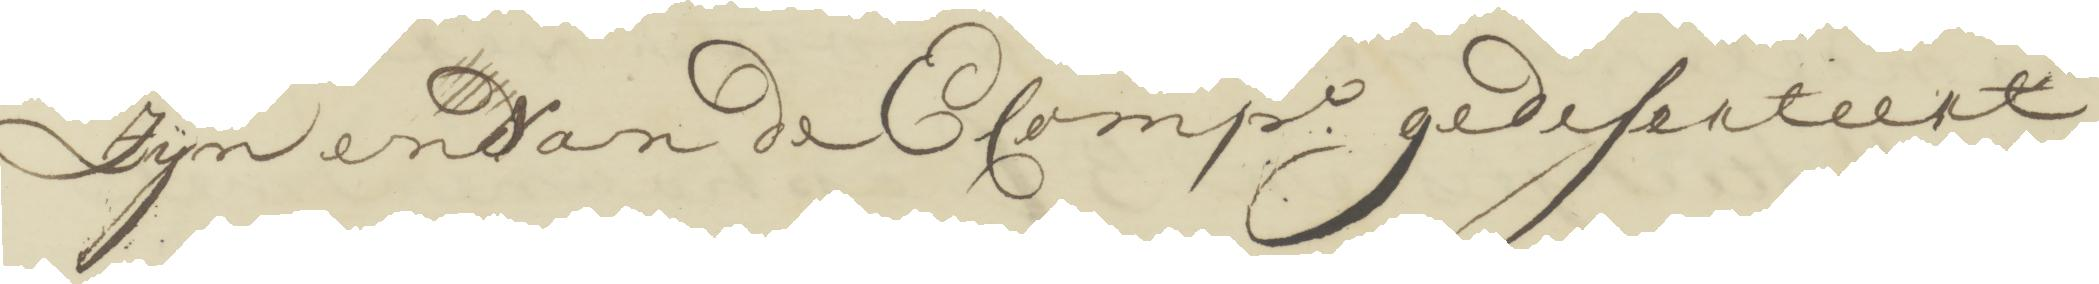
zijn en dan de EComp:e gedeserteert,
